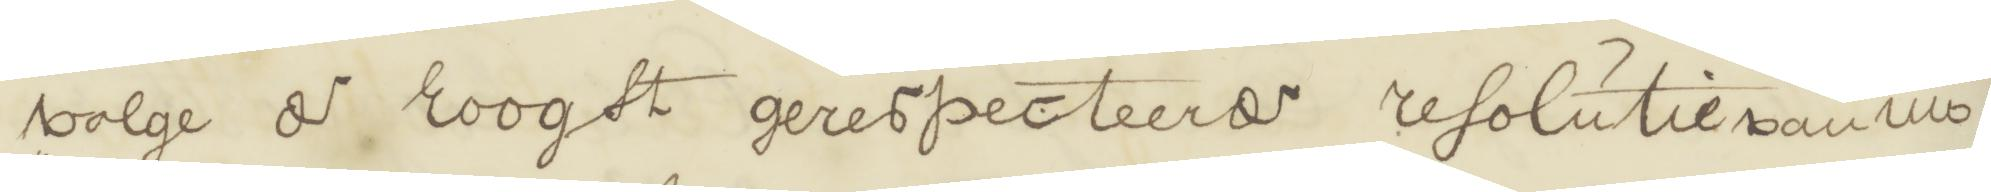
volge de hoogst gerespecteerde resolutie van uw
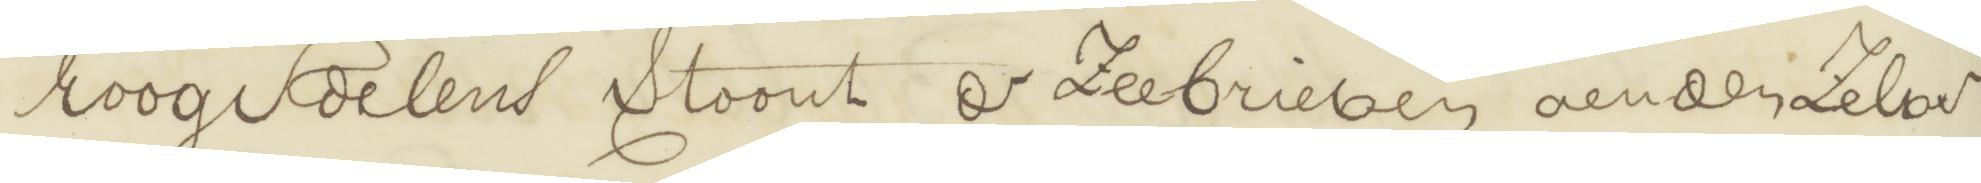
hoog Edelens vertoont de zeebrieven aen den zelve
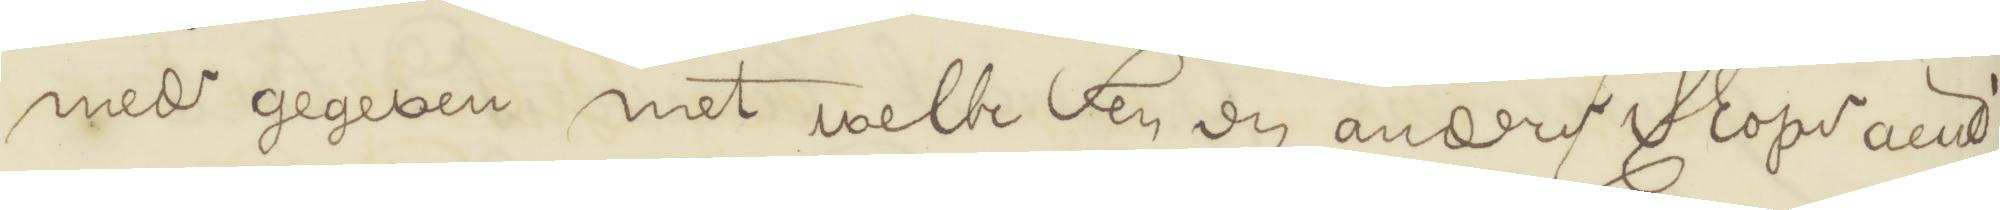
mede gegeven met welk Een en andere verhope aend'
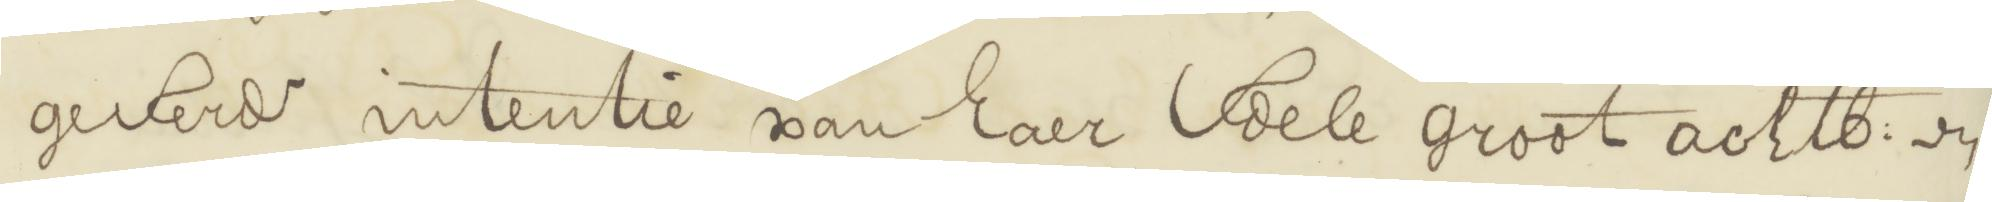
geEerde intentie van haer Edele groot achtb: en
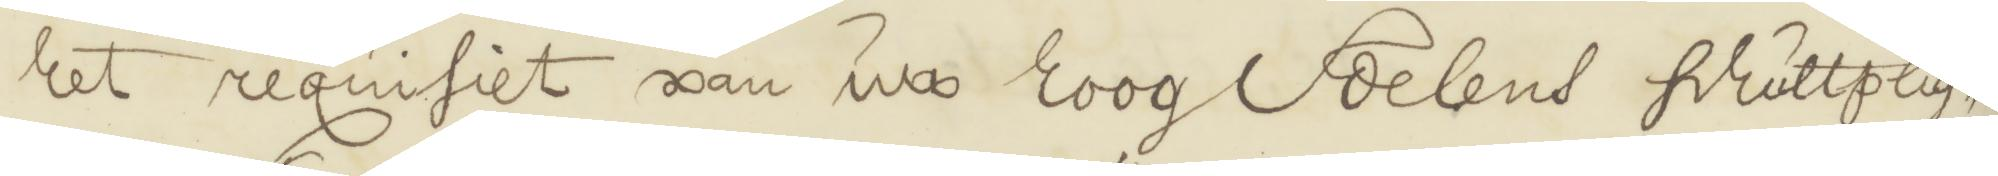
het requisiet van uw hoog Edelens schultplig„
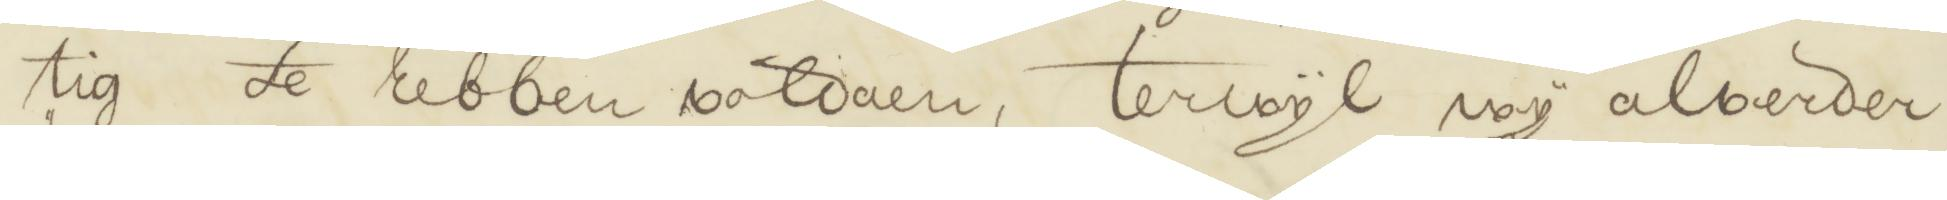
tig te hebben voldaen, terwijl wij alverder
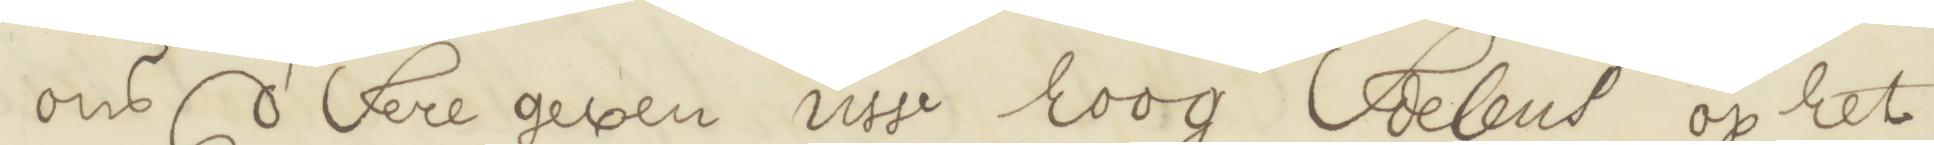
ons d’Eere geven uwe hoog Edelens op het
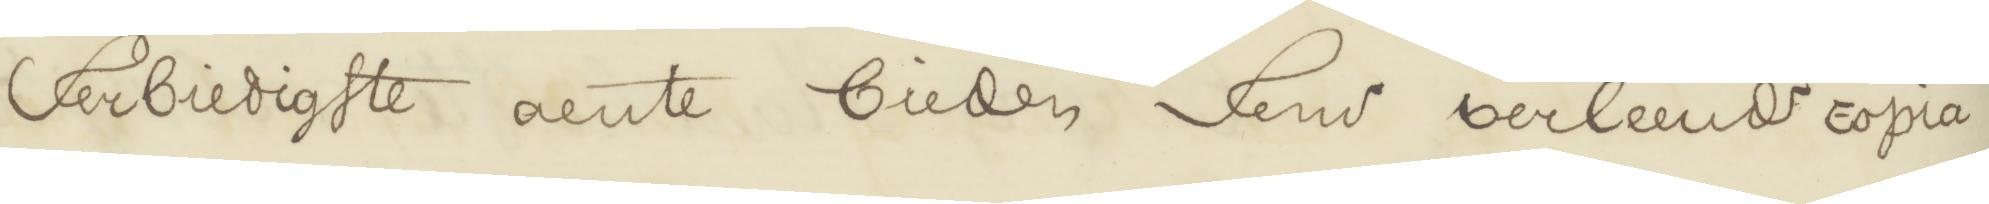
Eerbiedigste aente bieden Eene verleende copia
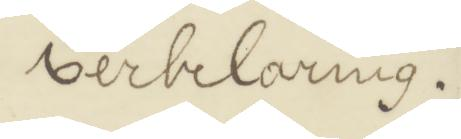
verklaring.
